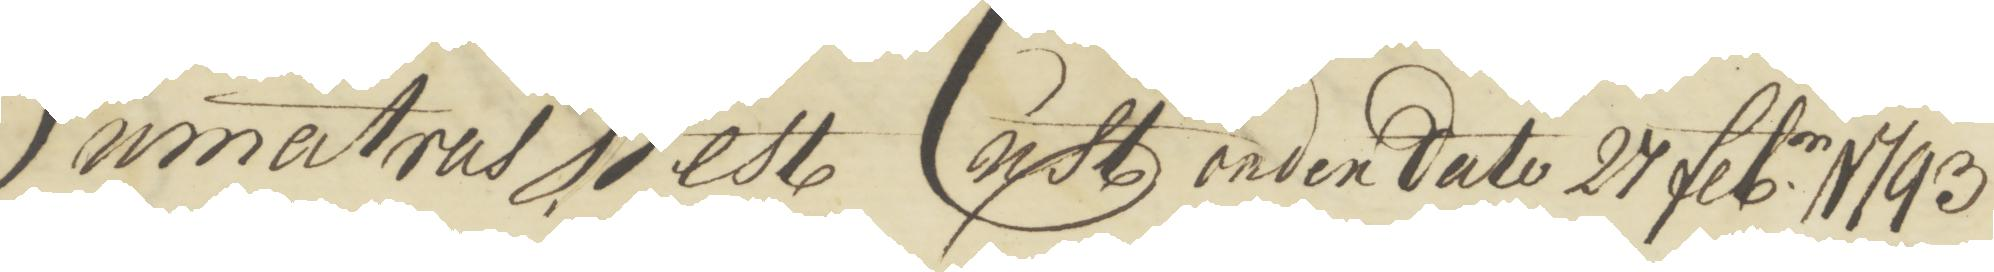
Van Sumatras West Cust onder dato 27 feb.r 1743
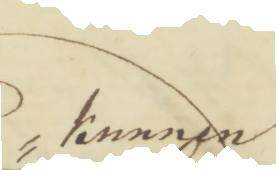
„kunnen
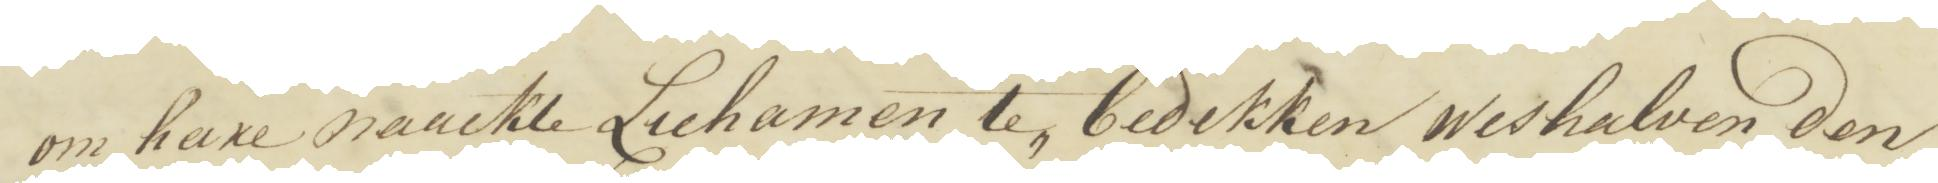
om hare naackte Lichamen te„ bedekken weshalven den
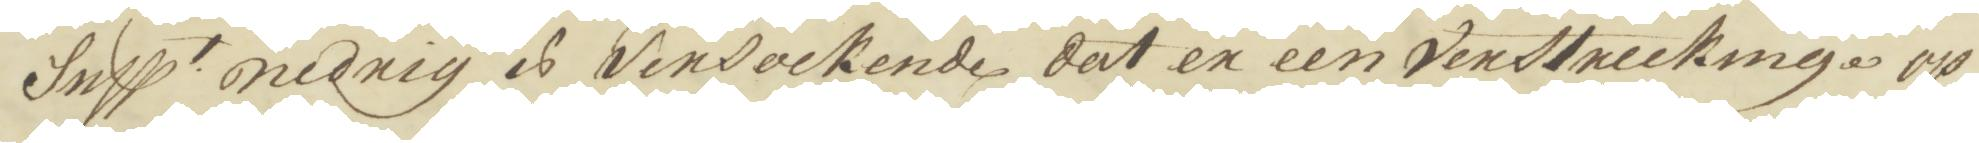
Supp:t nedrig is versoekende dat er een verstreckinge op
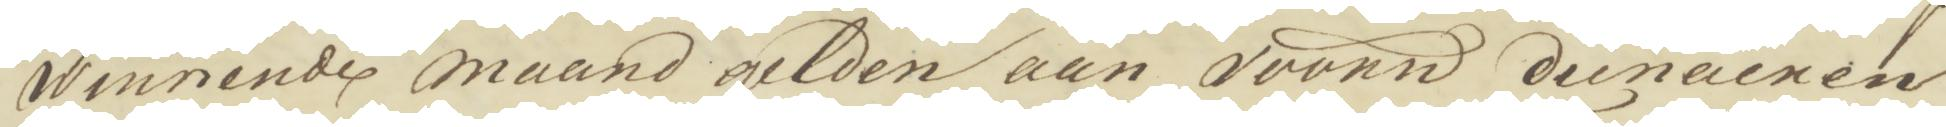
winnende maand gelden aan voorn dienaeren
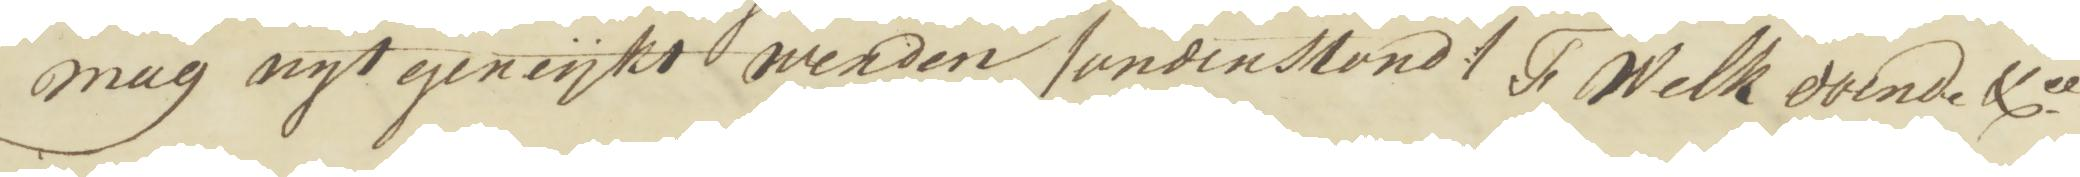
mag uyt gereijkt werden /onderstond:/ T Welk doende &.c
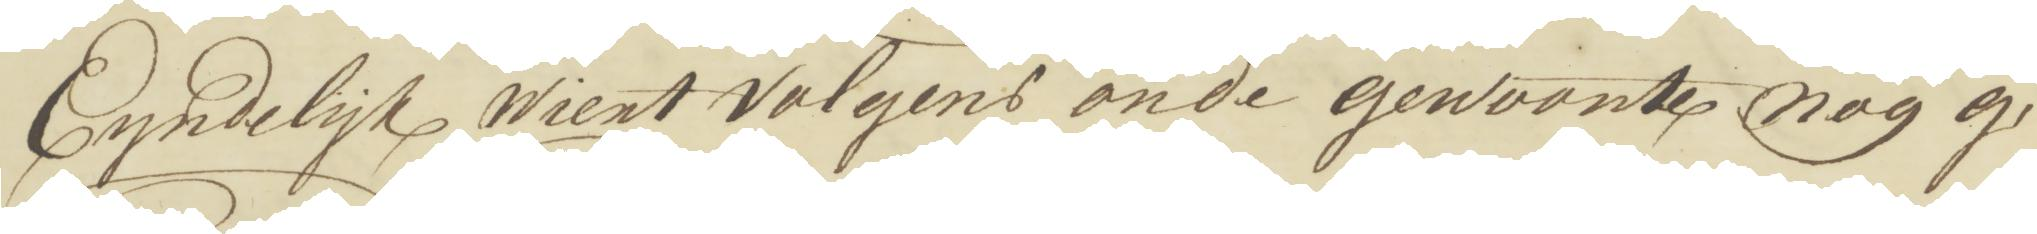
Eyndelijk wiert volgens oude gewoonte nog g'
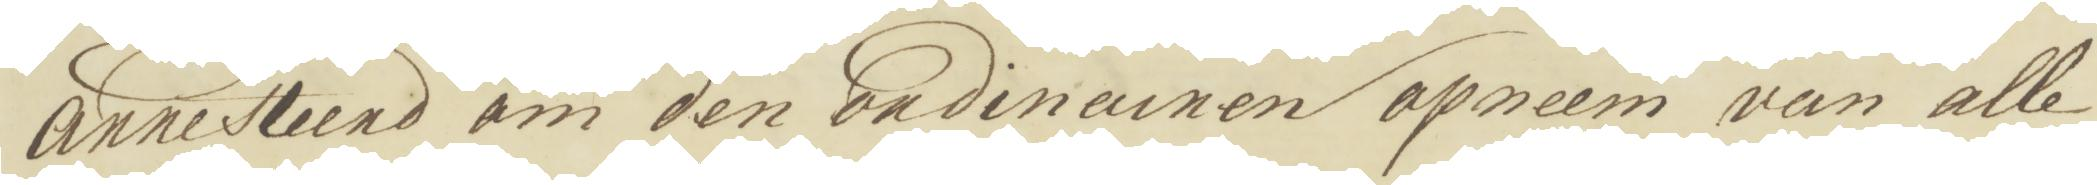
arresteerd om den ordinairen opneem van alle
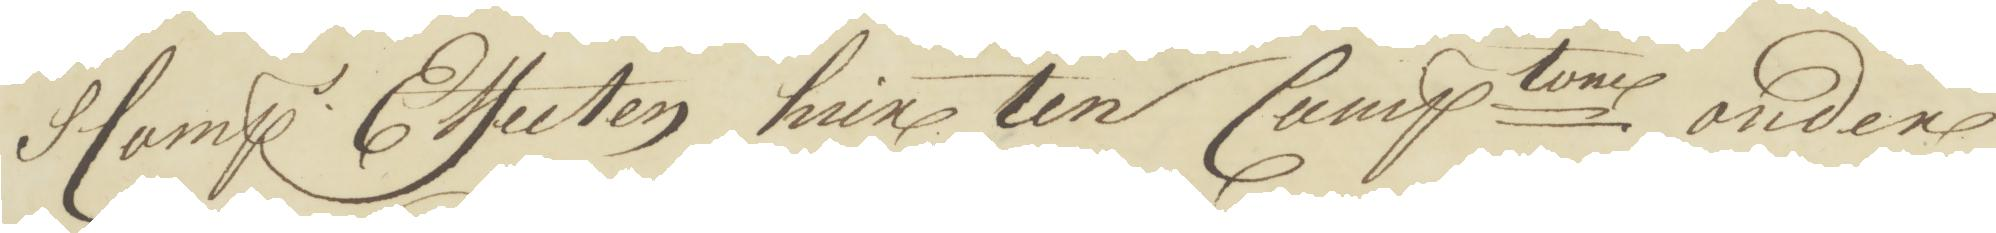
s Comp's Effecten hier ten Comp=tore onder
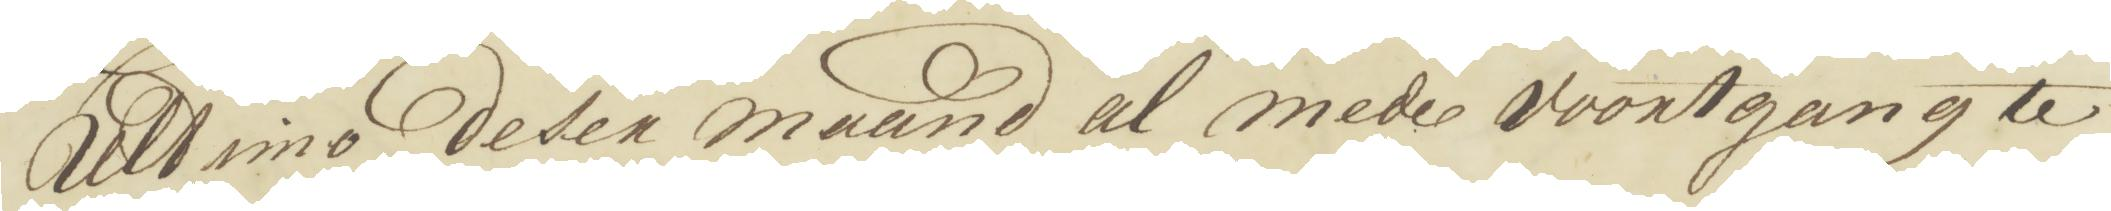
Ultimo deser maand al mede voortgang te
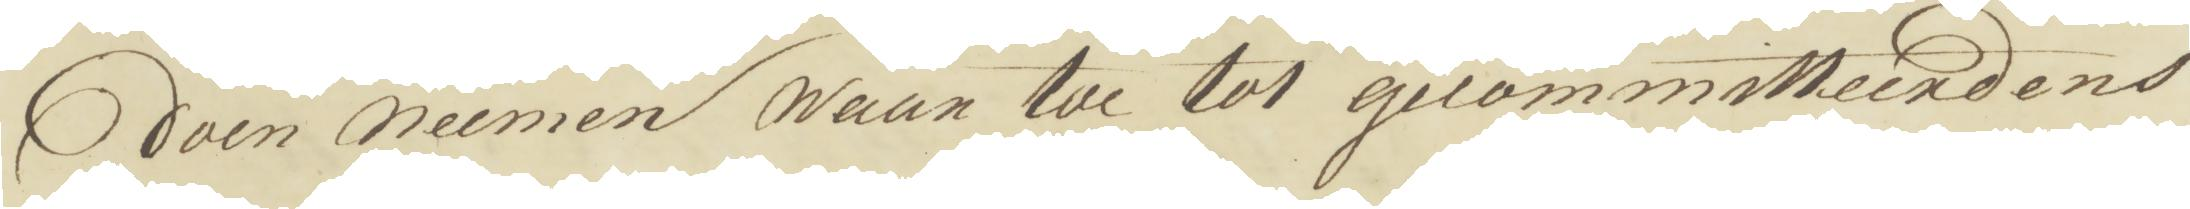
doen neemen waar toe tot gecommitteerdens
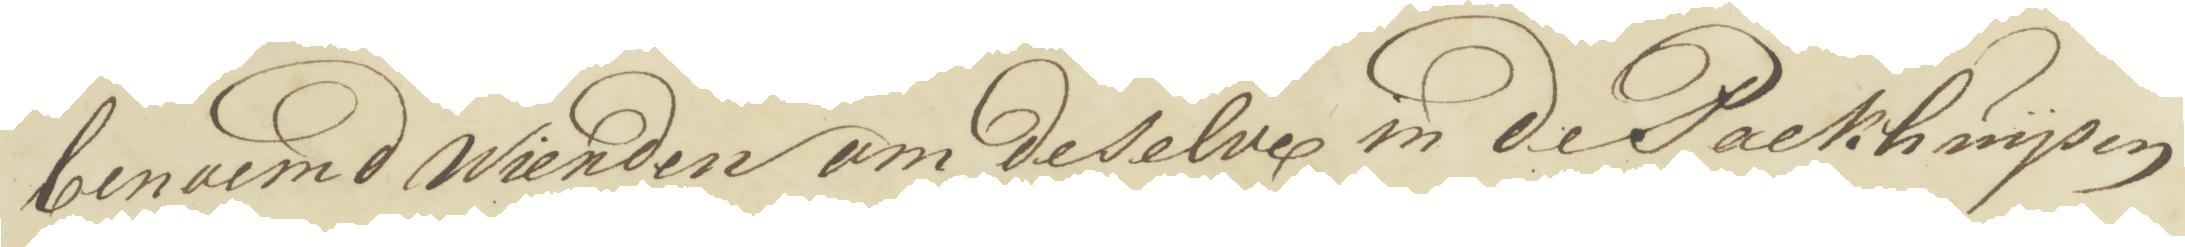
benoemd wierden om deselve in de Packhuijsen
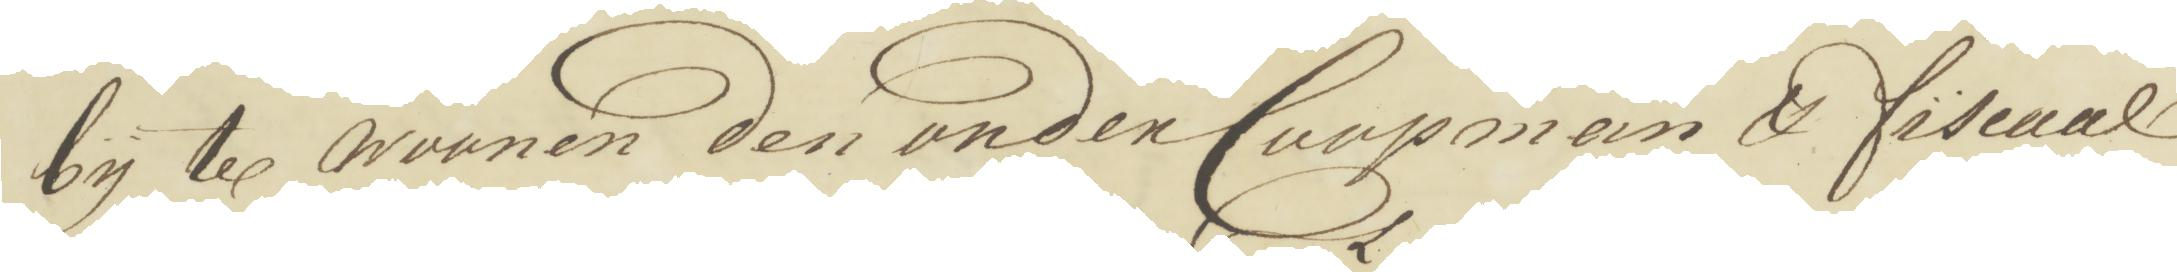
bij te woonen den onder Coopman & fiscaal
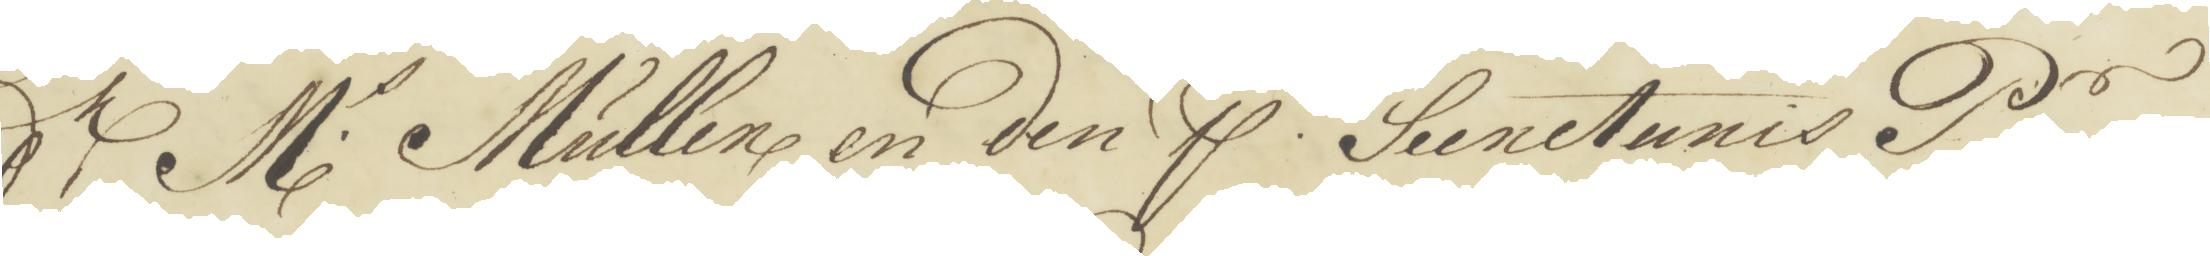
d,k M.s Muller en den P.l Secretaris P„r
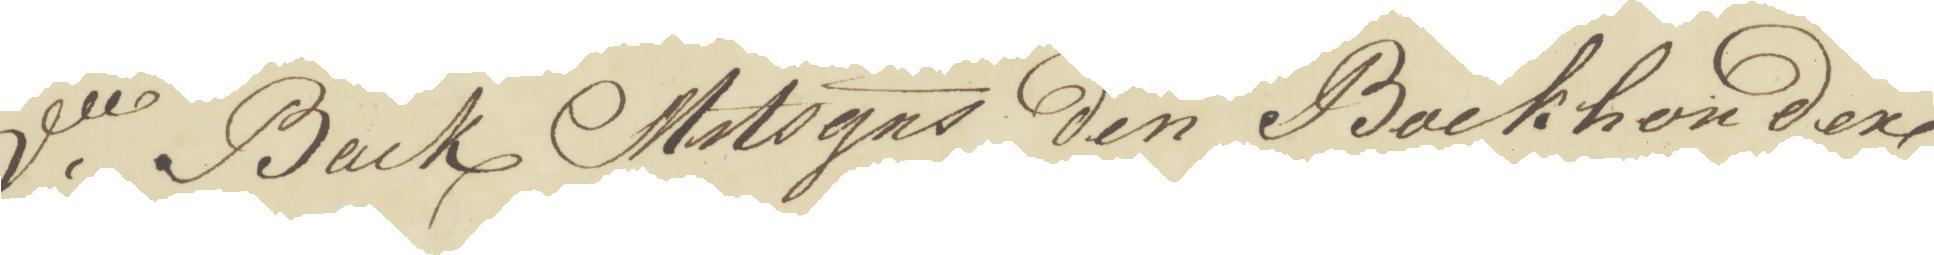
V. Back Mitsgrs den Boekhouder
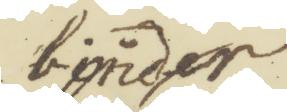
binder
